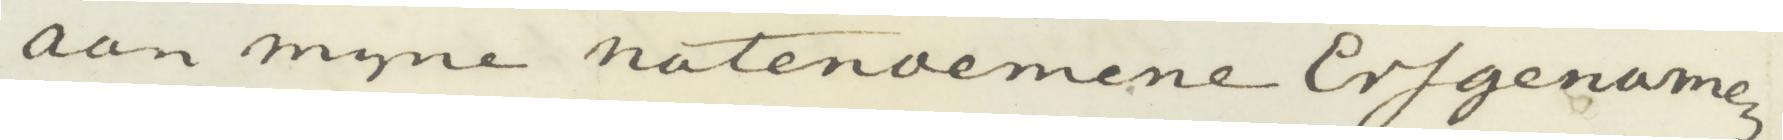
aan myne natenoemene Erfgenamen
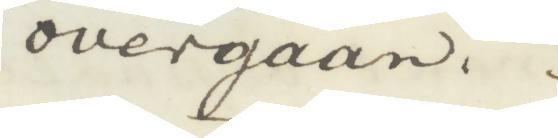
overgaan.
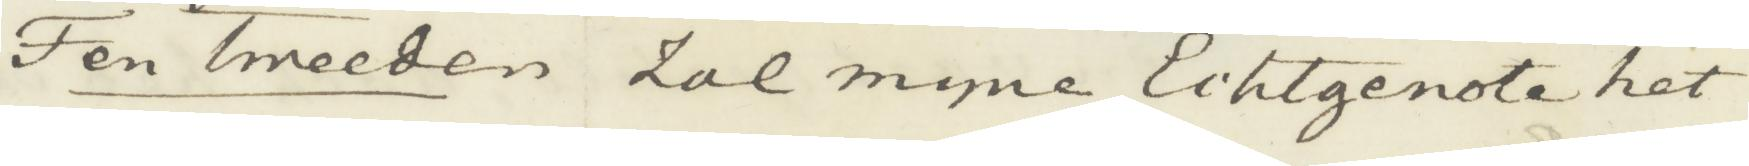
Ten tweeden zal myne Echtgenote het
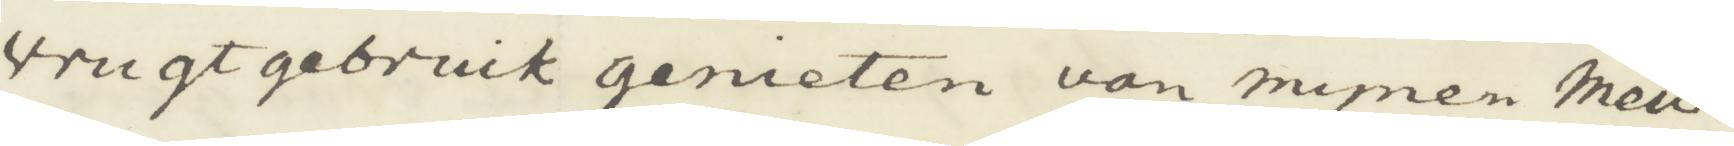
vrugtgebruik genieten van mynen meu
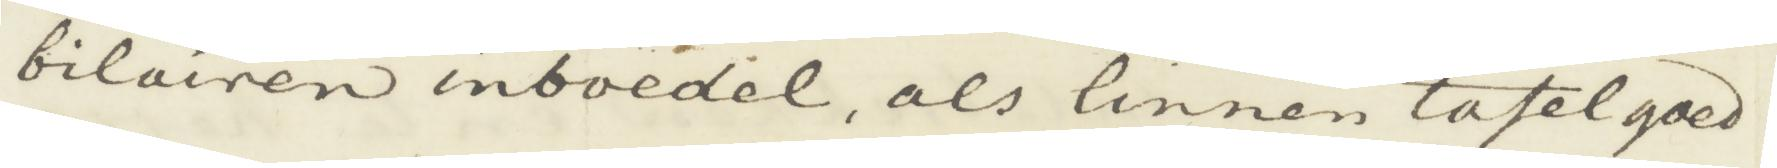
bilairen inboedel, als linnen tafel goed
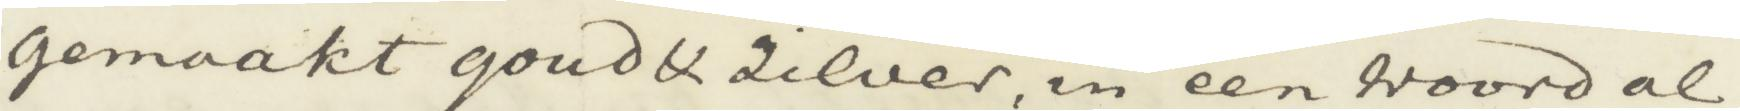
gemaakt goud & zilver, in een woord al
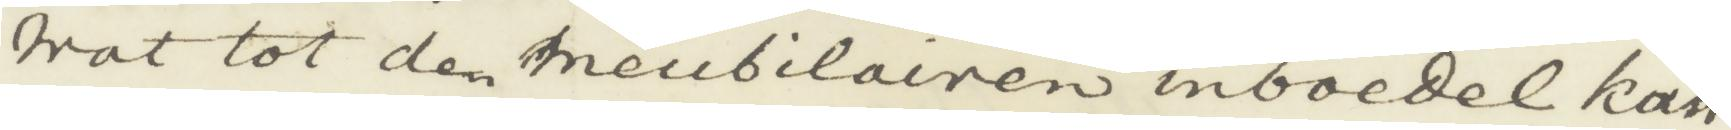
wat tot den meubilairen inboedel kan
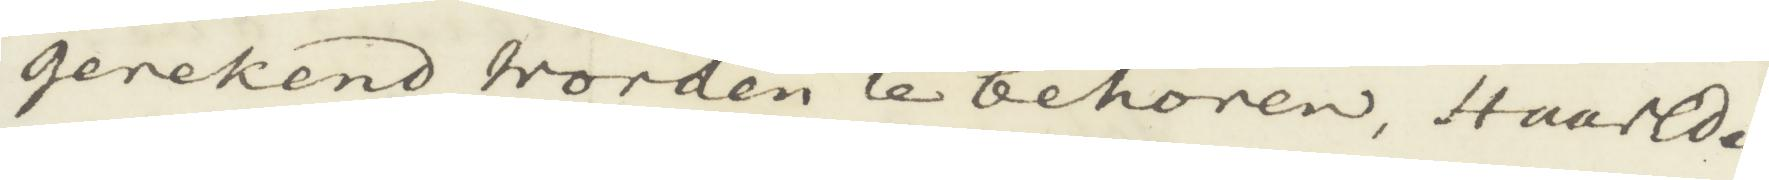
gerekend worden te behoren, Haar Ede
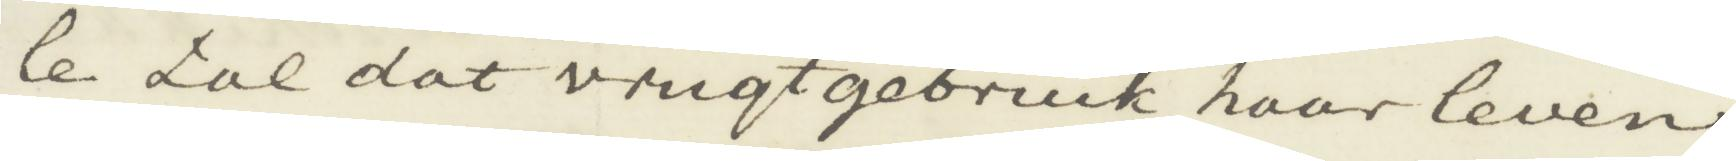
le zal dat vrugtgebruik haar leven
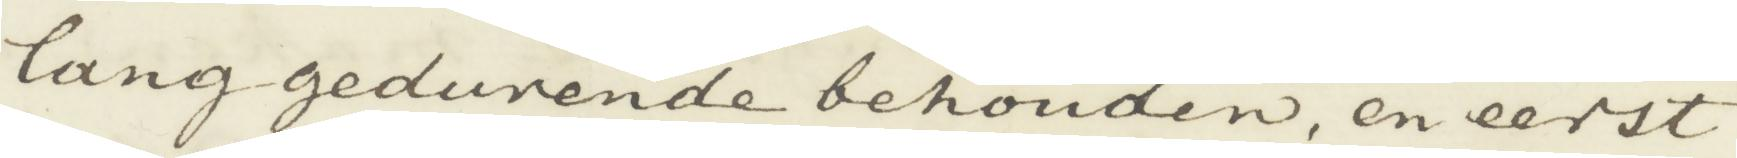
lang gedurende behouden, en eerst
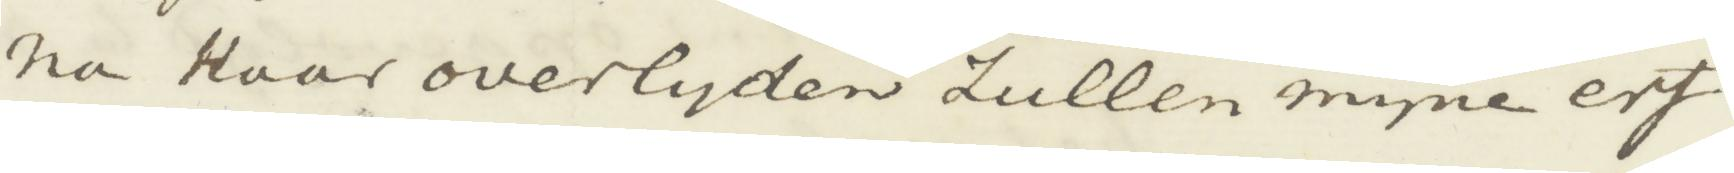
na Haar overlyden zullen myne erf
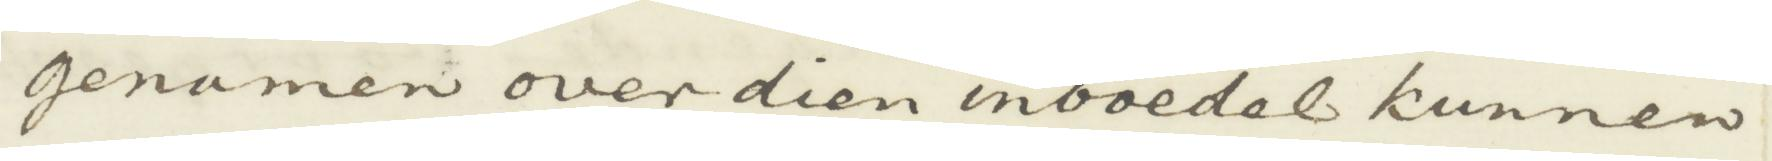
genamen over dien inboedel kunnen
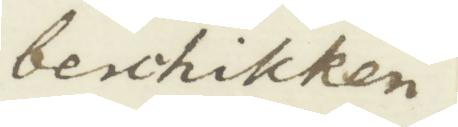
beschikken
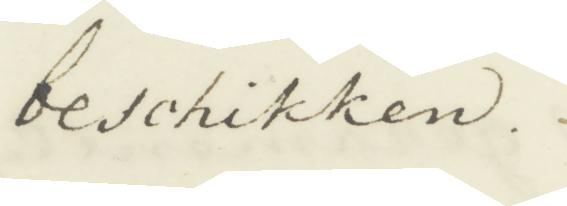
beschikken.
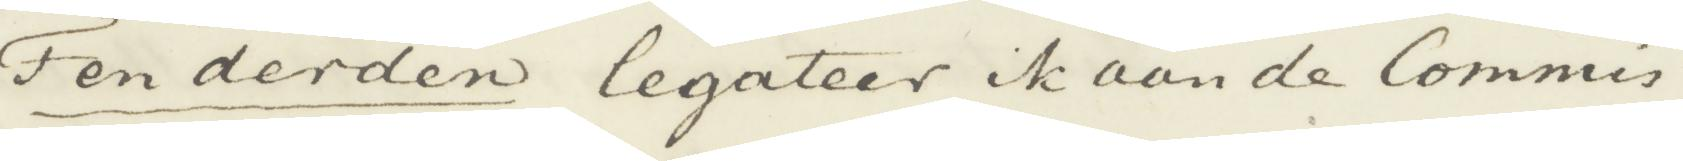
Ten derden legateer ik aan de Commis
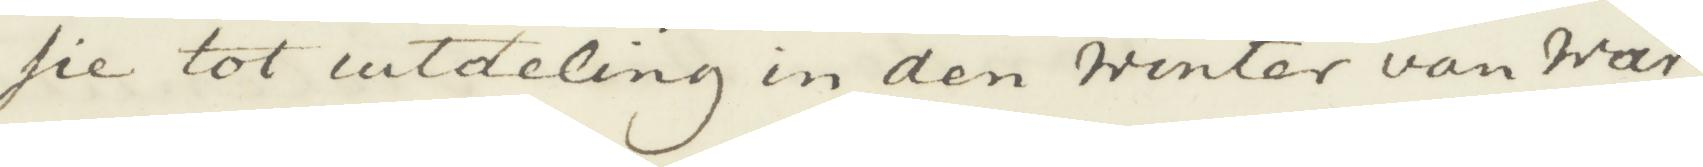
sie tot uitdeling in den winter van war
